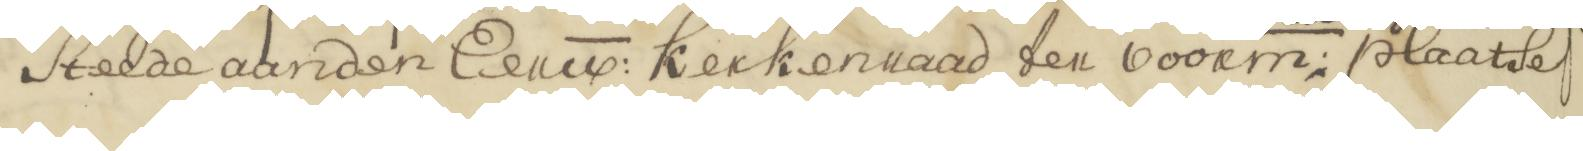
Steede aan den Eerw: kerkenraad ter voorm: plaatse
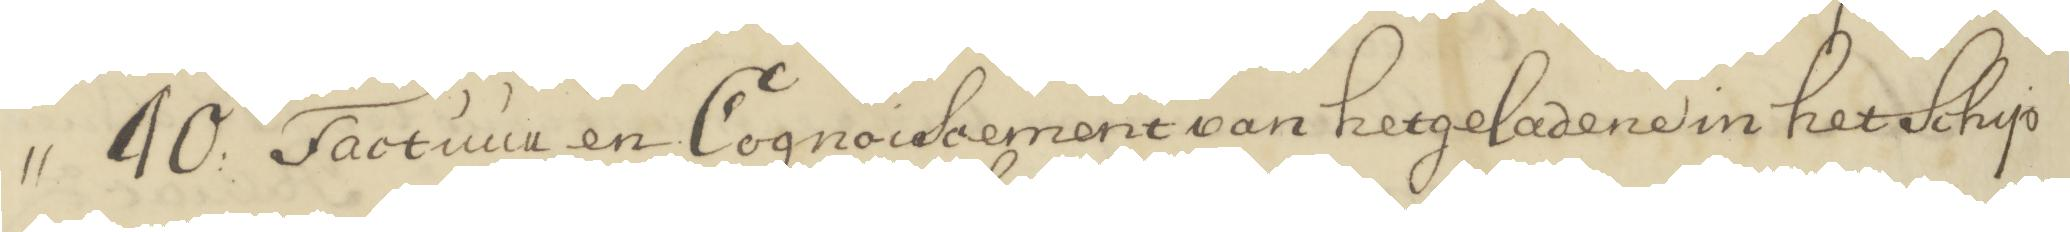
„ 40: Factuur en Cognoiscement van het geladene in het Schip
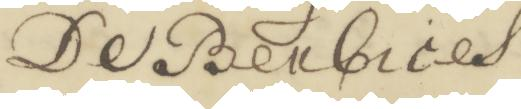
De Berbices
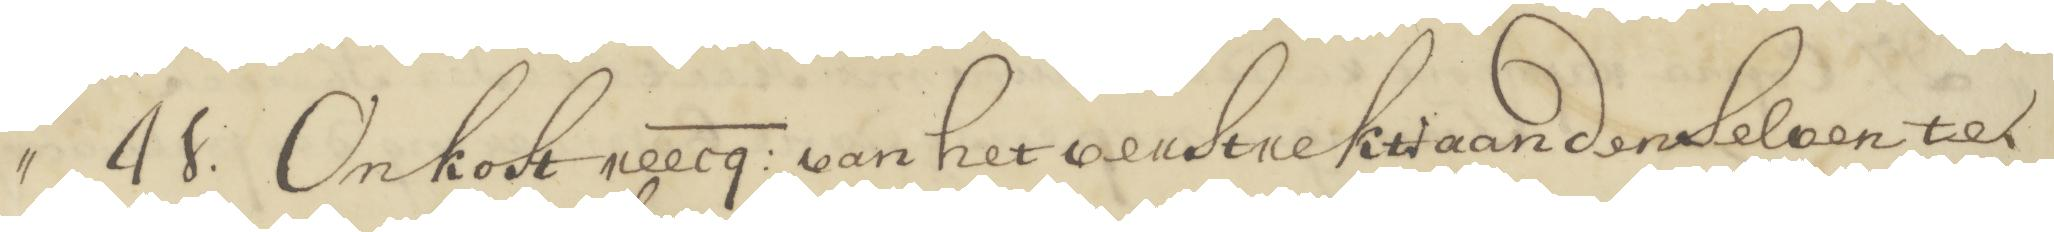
„ 41: Onkost reecq: van het verstrekte aan denselven te
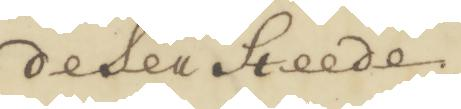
deser Steede.
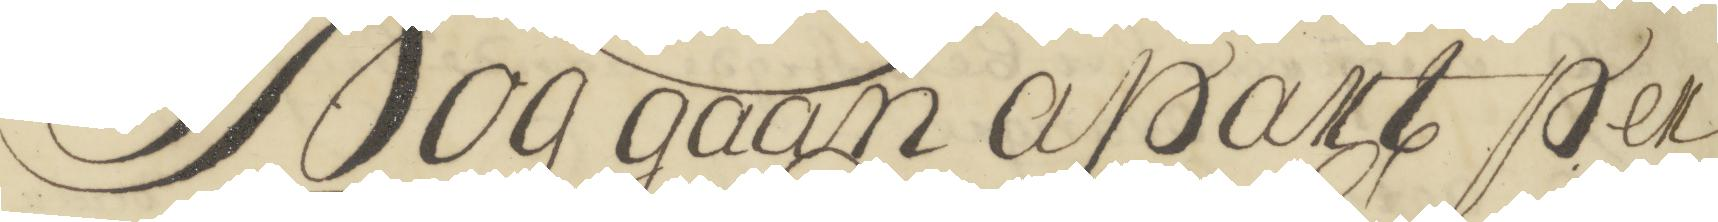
Nog gaan apart per
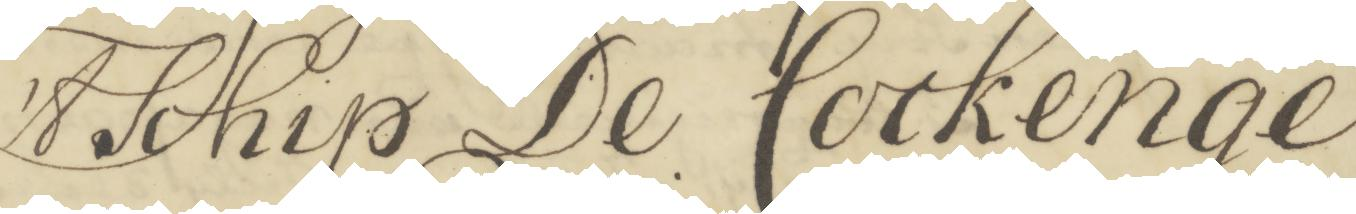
't Schip De Cockenge
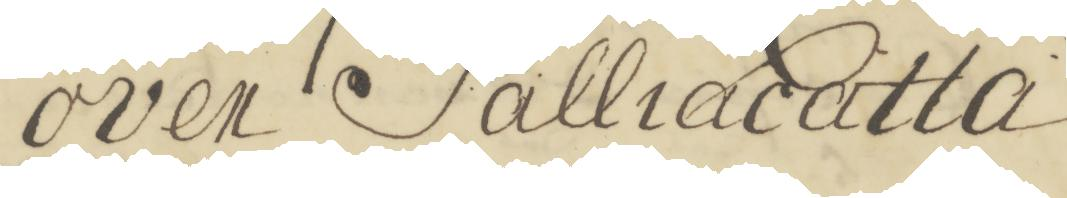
over Palliacatta
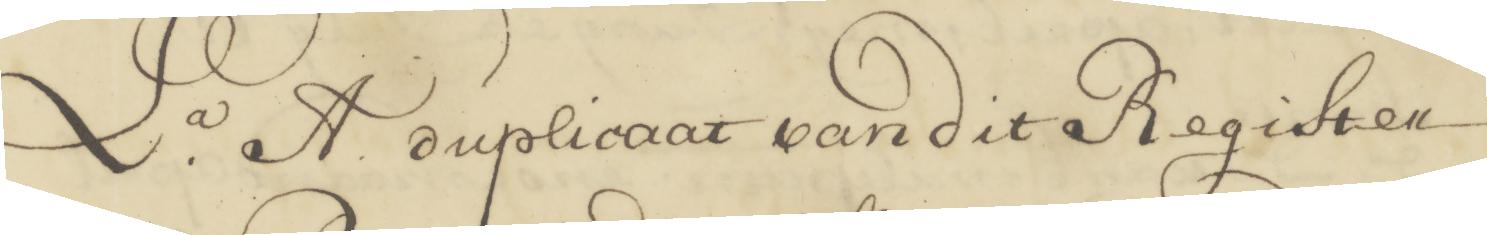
L.a A. duplicaat van dit Register
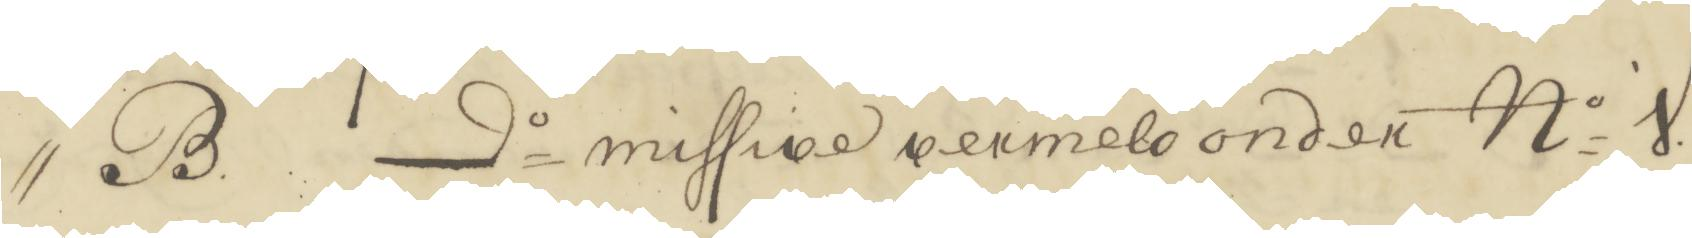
„ B. D=o missive vermeld onder N=o 1.
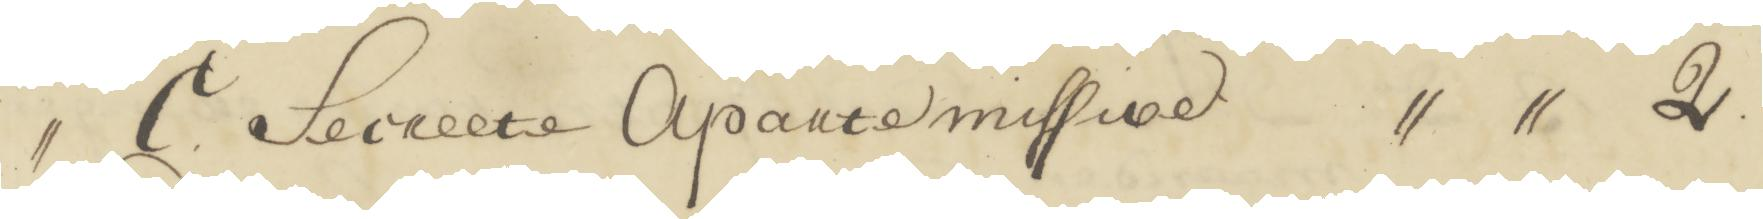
„ C: Secreete Aparte missive „ „ 2.
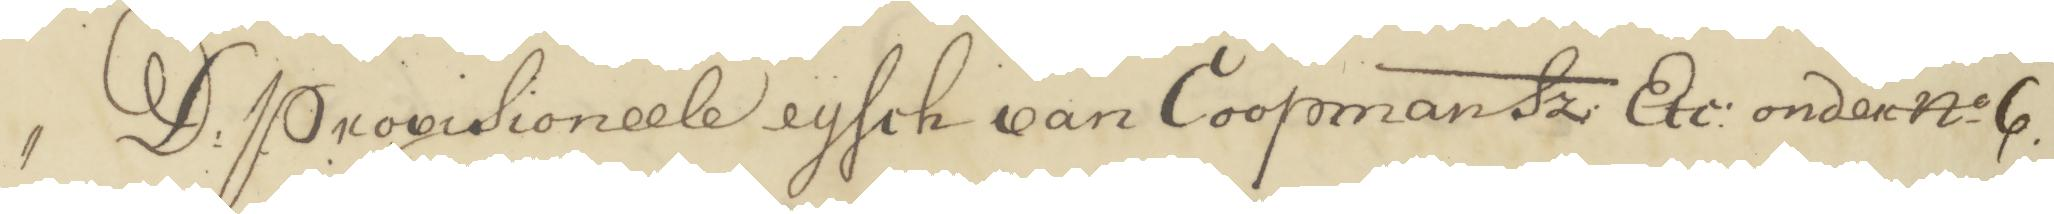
„ D: provisioneele eijsch van Coopmansz: Etc: onder N-o 6.
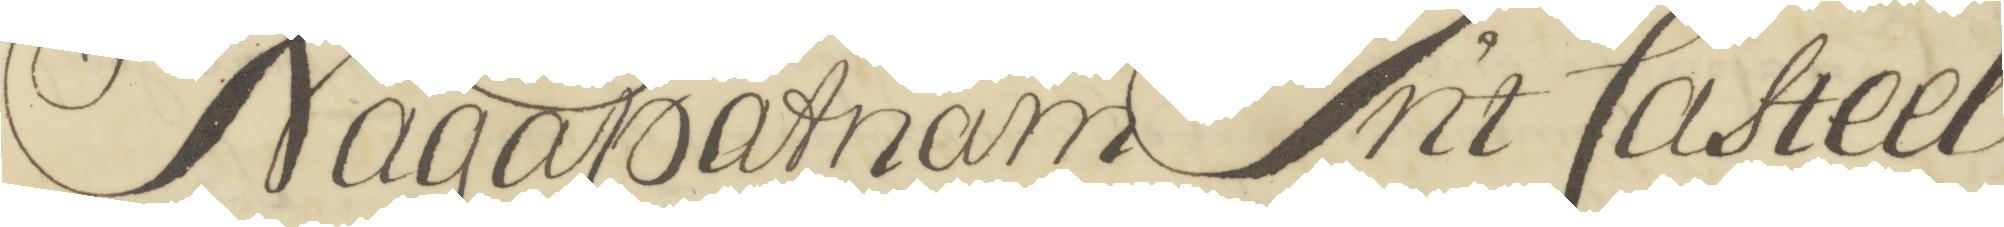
Nagapatnam In't Casteel
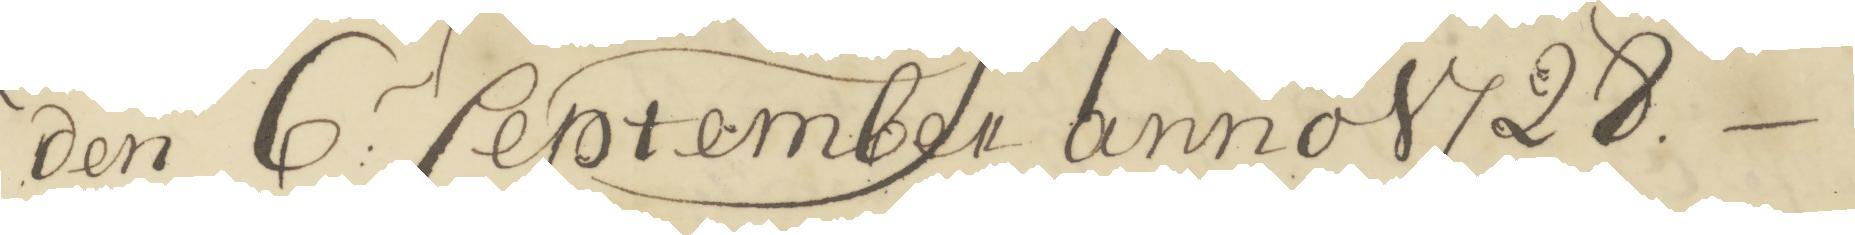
den 6:' September anno 1728.—
